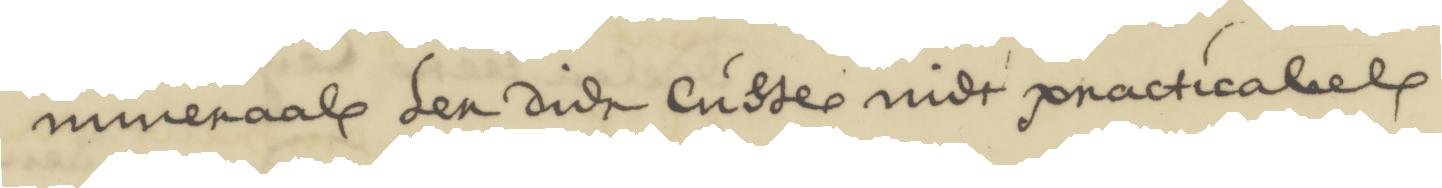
mineraal ter dier Custe niet practicabel
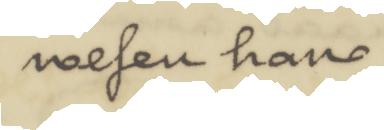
wesen kan
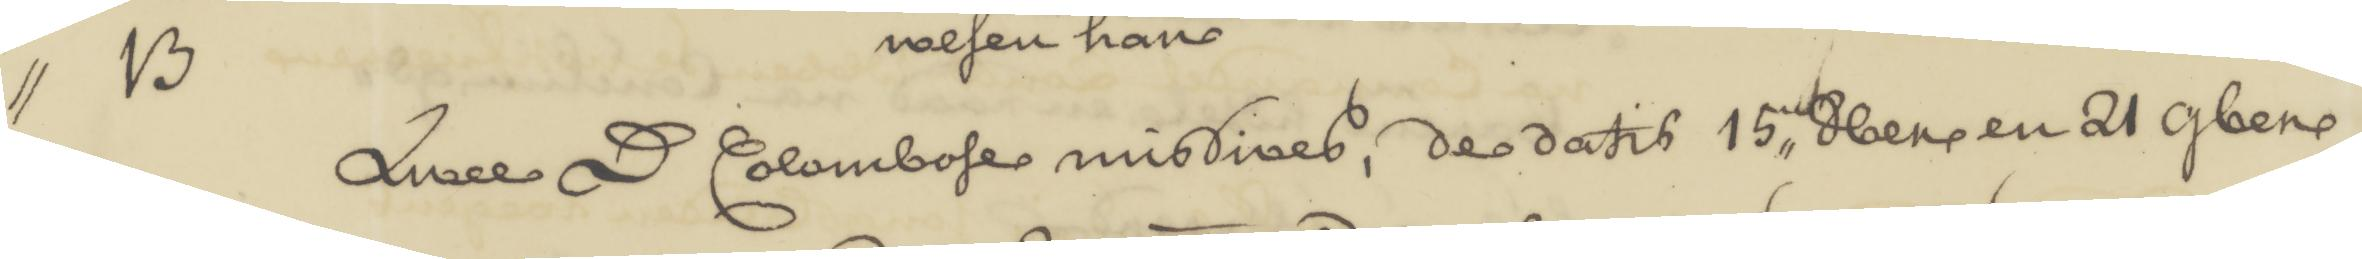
„ 13 Twee E Colombose missives, de datis 15„n 8ber en 21 9ber
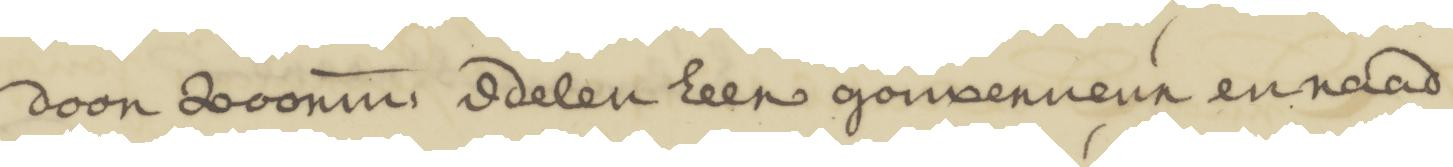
door voorm: Edelen heer gouverneur en raad
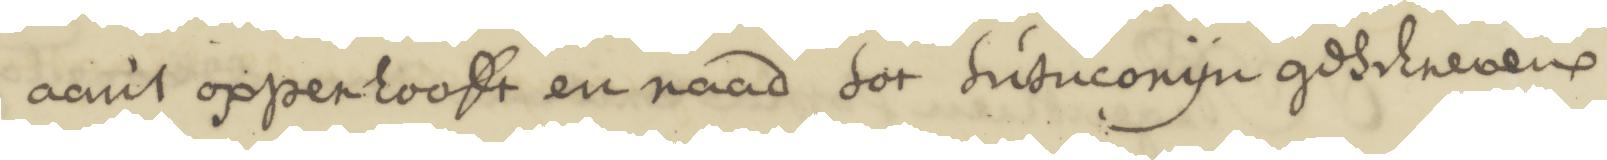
aan ’t opperhooft en raad tot tutucorijn geschreven
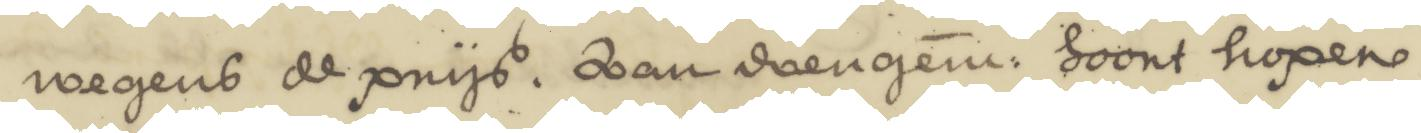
wegens de prijs, van even gem: soort koper
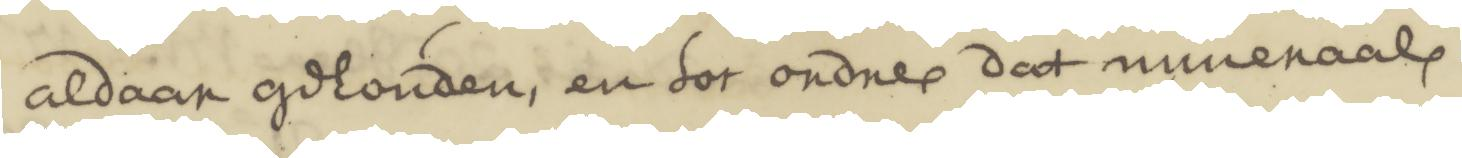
aldaar gehouden, en tot ordre dat mineraal
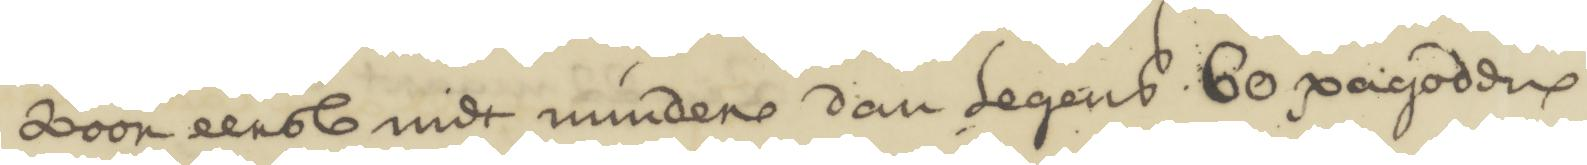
voor eerst niet minder dan tegens. 60 pagoden
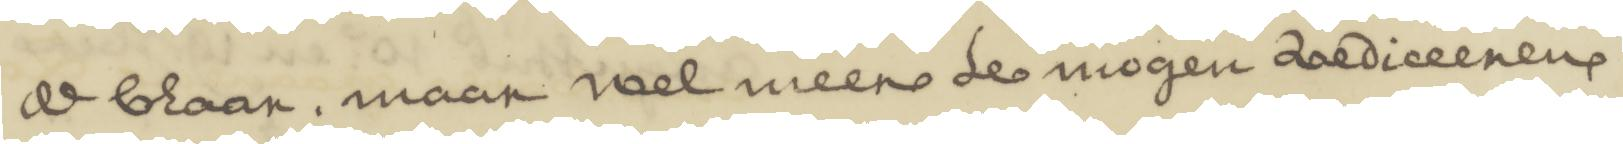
de bhaar, maar wel meer te mogen dediceeren
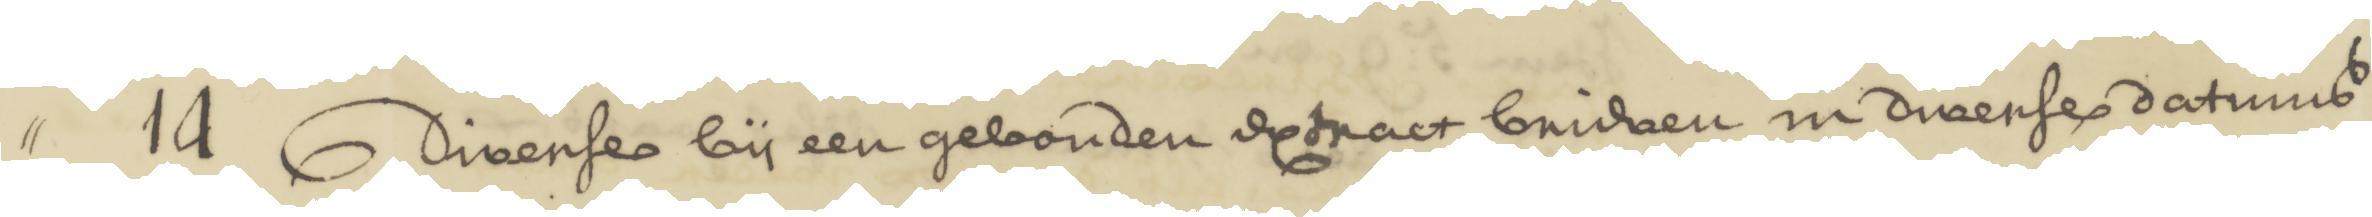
„ 14 diverse bij een gevonden extract brieven in diverse datums
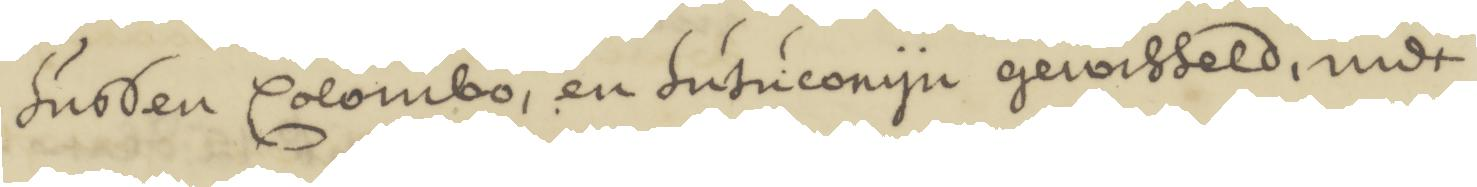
tussen Colombo, en tutucorijn gewisseld, met
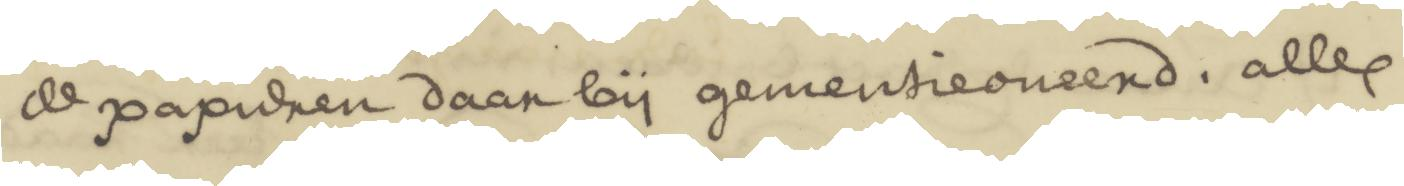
de papieren daar bij gementieoneerd, alle
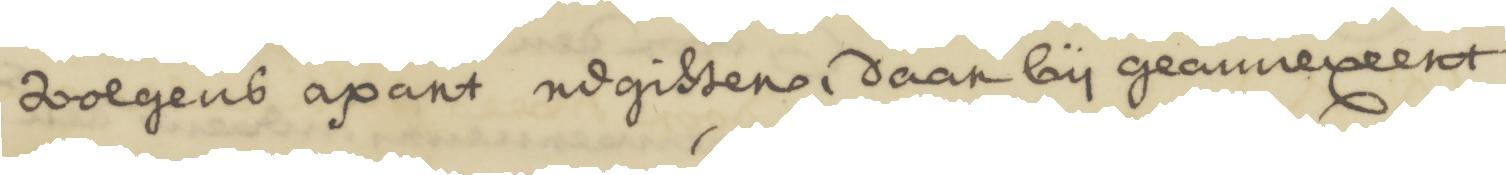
volgens apart register, daar bij geannexeert
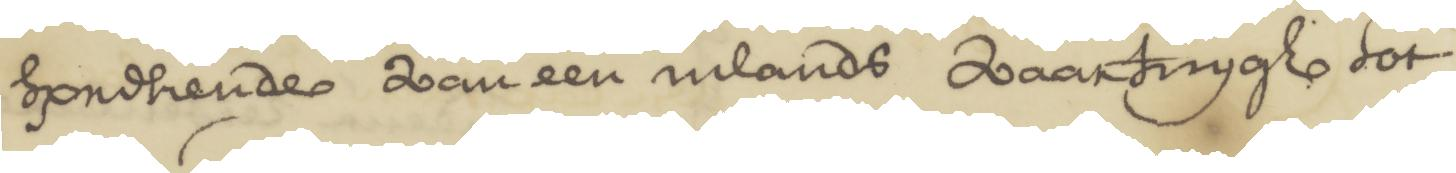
sprekende van een inlands vaartuygh tot
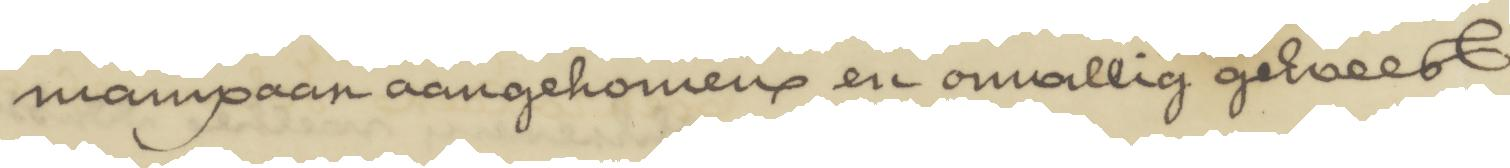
manipaar aangekomen en onwillig geweest
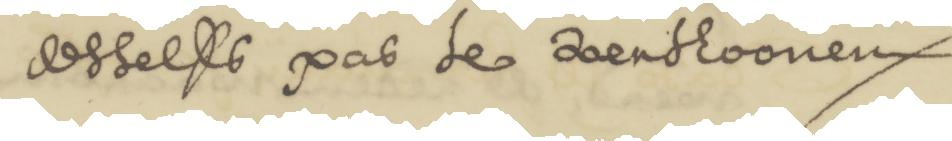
desselfs pas te verthoonen
